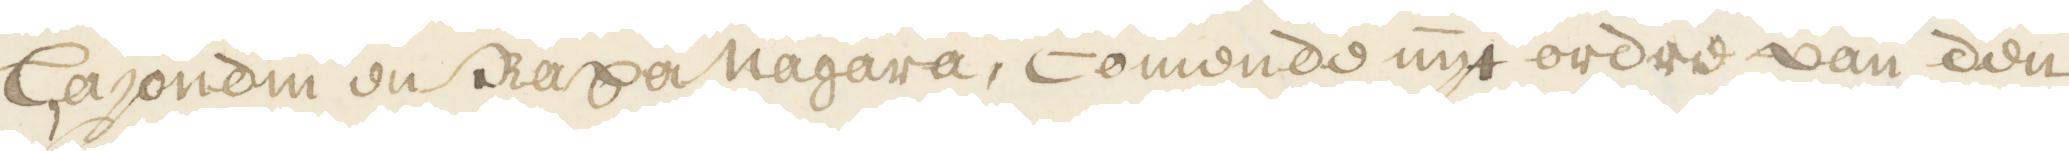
Cajoudin en Rapa Nagara, Comende uijt ordre van den
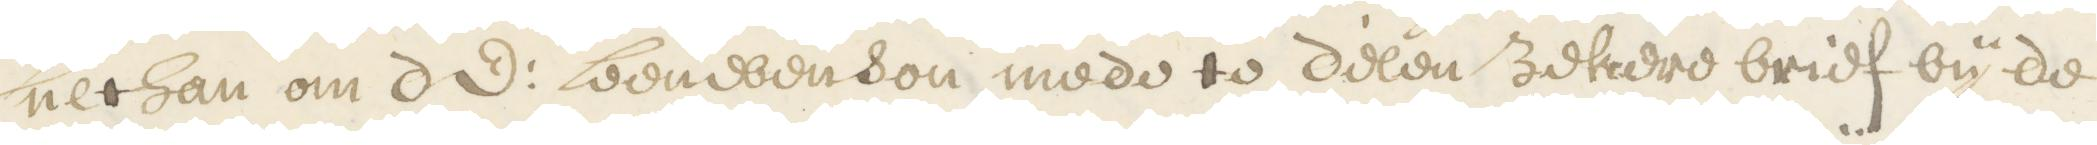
ulthan om d E: leeuwenson mede te delen zekere brief bij de
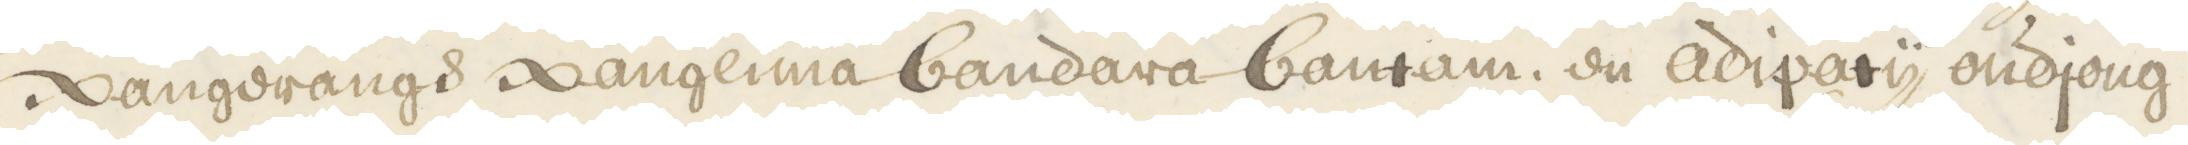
pangerangs panglima bandara bantam, en adipatij ondjong
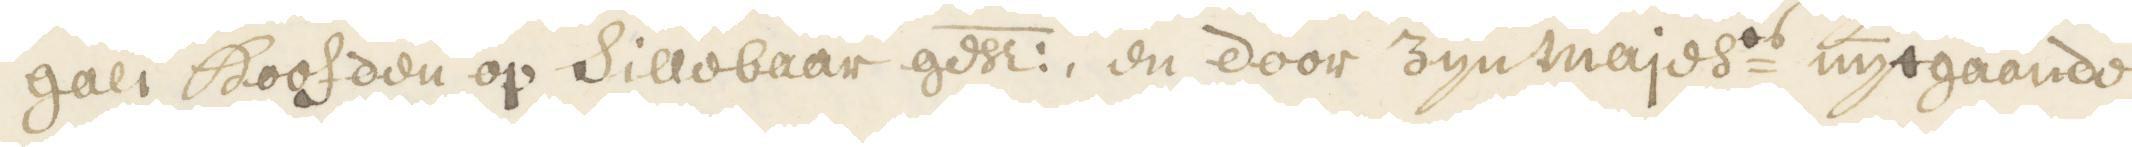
gali Hoofden op Sillebaar gesz:, en door zijn majes=ts uijtgaande
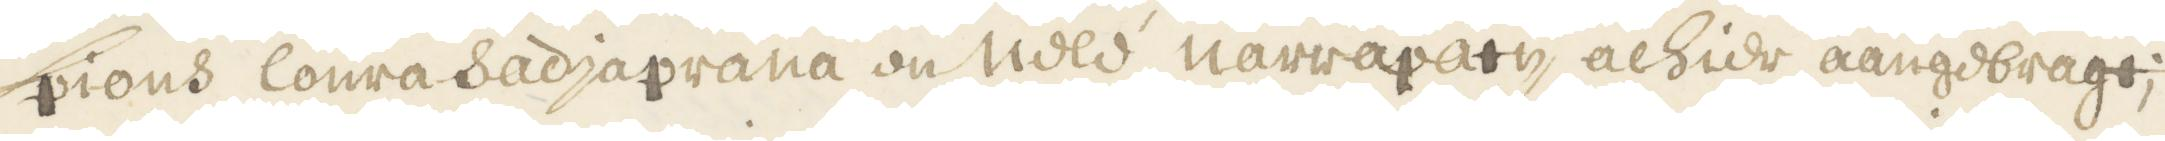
pions Coura sadjaprana en Nele Narrapaty alhier aangebragt;
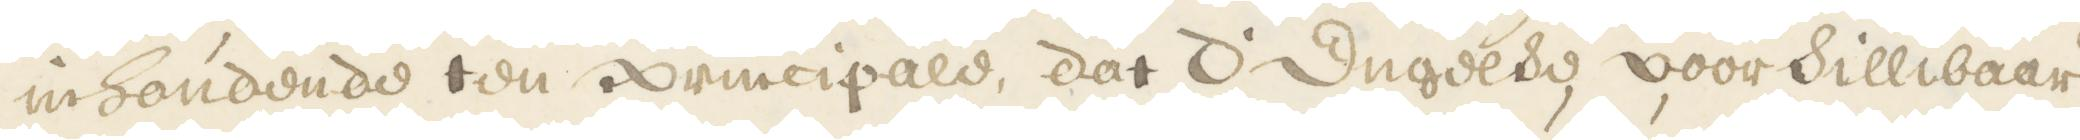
inhoudende ten principale, dat d'Engelse voor Sillibaar
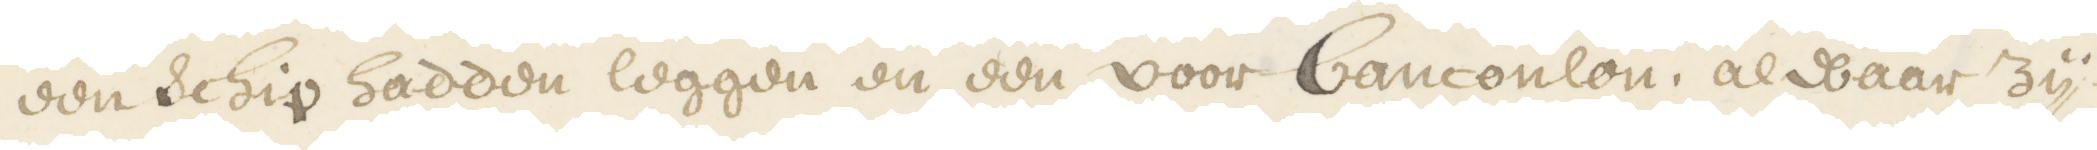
een schip hadden leggen en een voor Bancoulou, alwaar zij
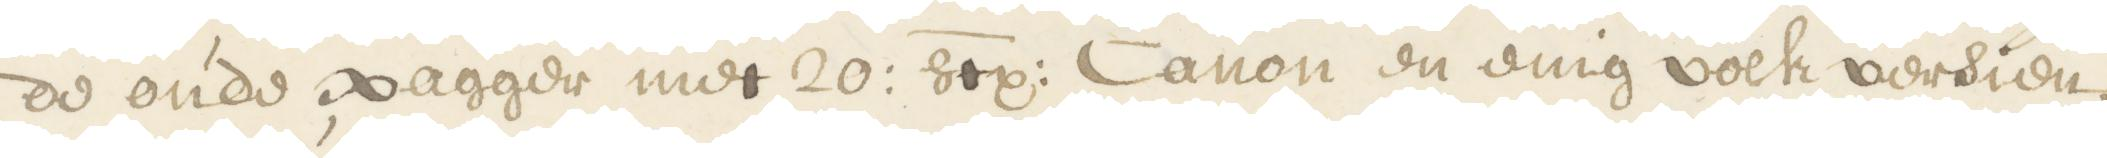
de oude pagger met 20: stx: Canon en enig volk versien,
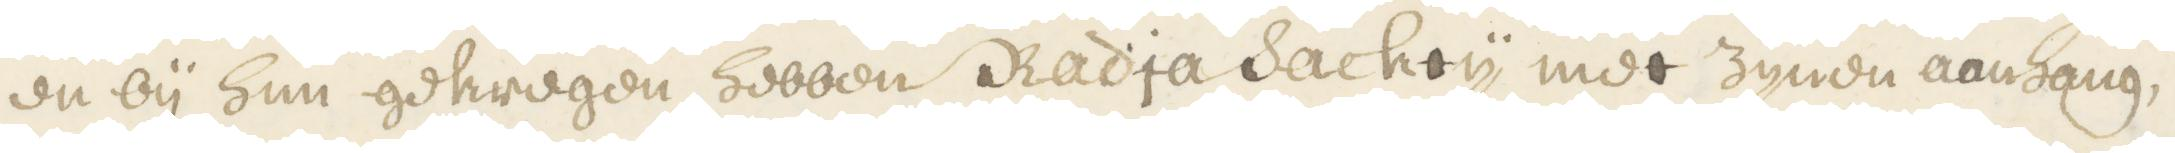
en bij hun gekregen hebben Radja Sacktij met zijnen aanhang,
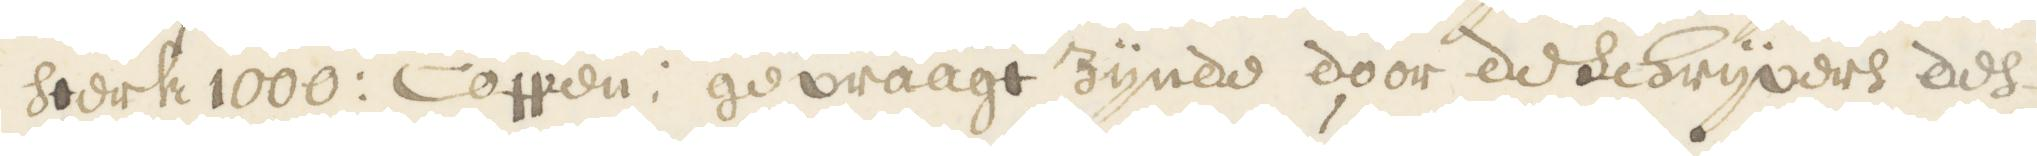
sterk 1000: Coppen: gevraagt zijnde door de schrijvers des
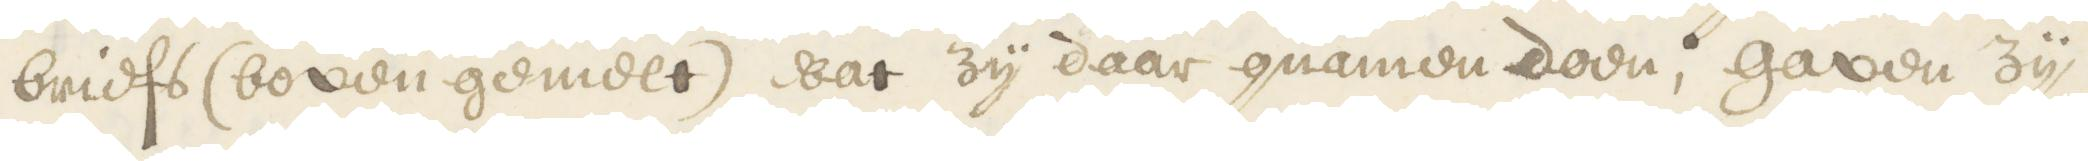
briefs (boven gemelt) wat zij daar quamen doen, gaven zij
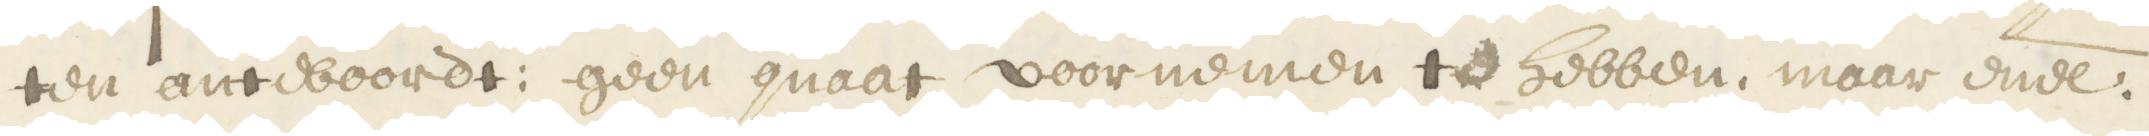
ten antwoordt: geen quaat voornemen te hebben, maar enel.
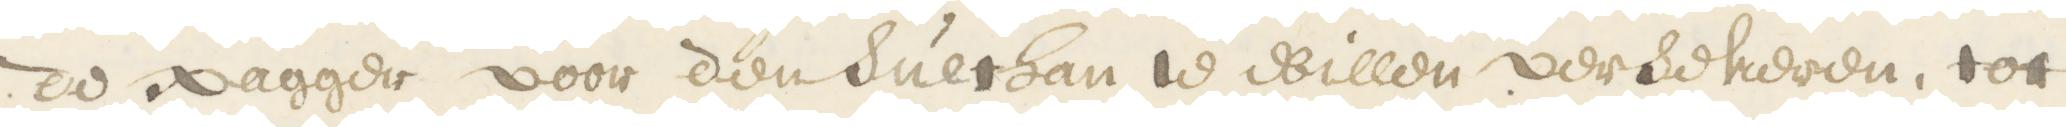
de pagger voor den Sulthan te willen versekeren, tot
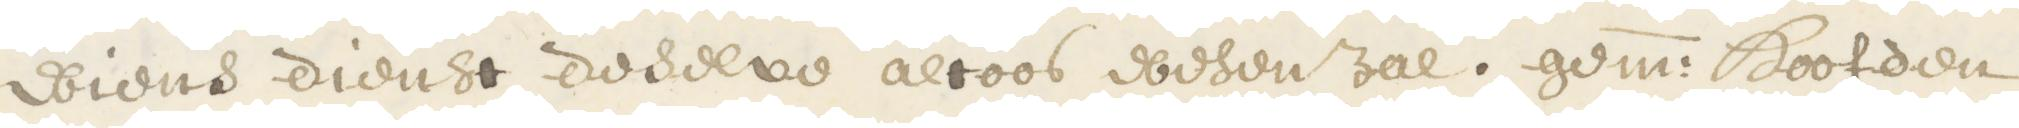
wiens dienst deselve altoos wesen zal. gem: Hoofden
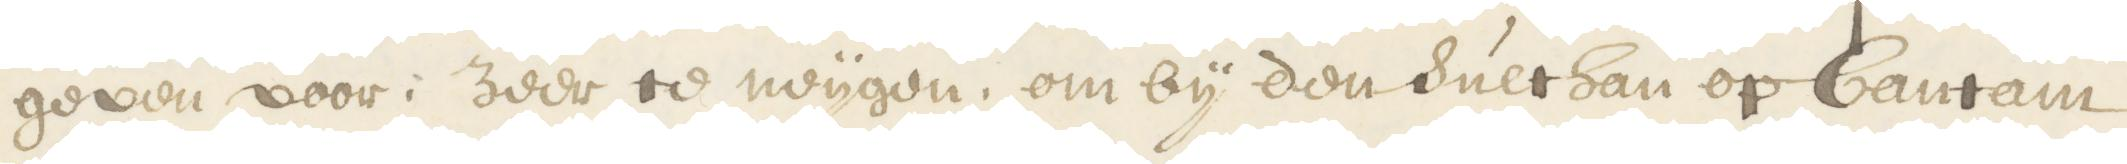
geven voor: zeer te neijgen, om bij den Sulthan op Bantam
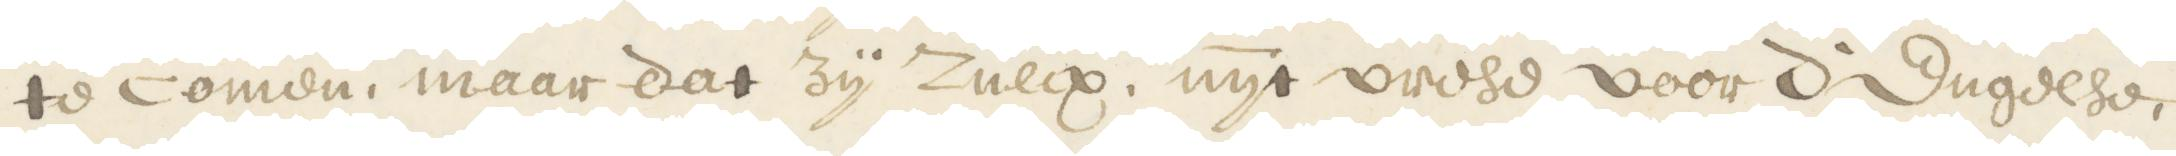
te comen, maar dat zij zulcx, uijt vrese voor d' Engelse,
